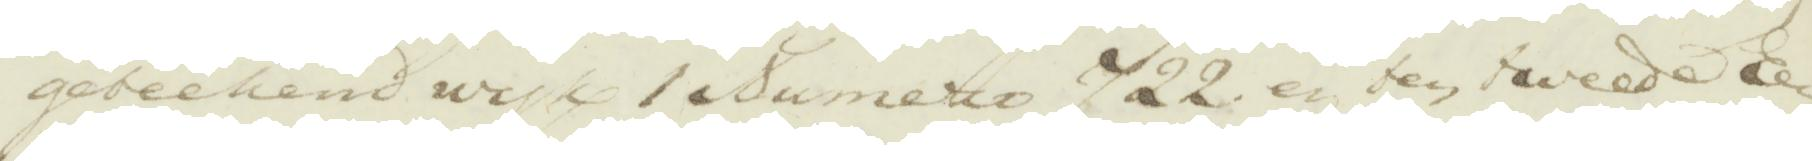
geteekend wyk 1 Numero 722 en ten tweede Een
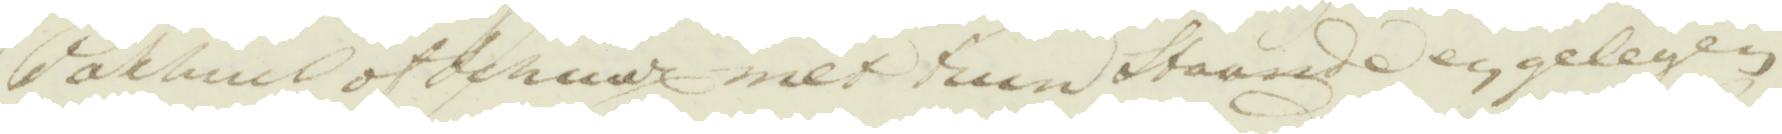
Pakhuis of schuur met tuin staande en gelegen
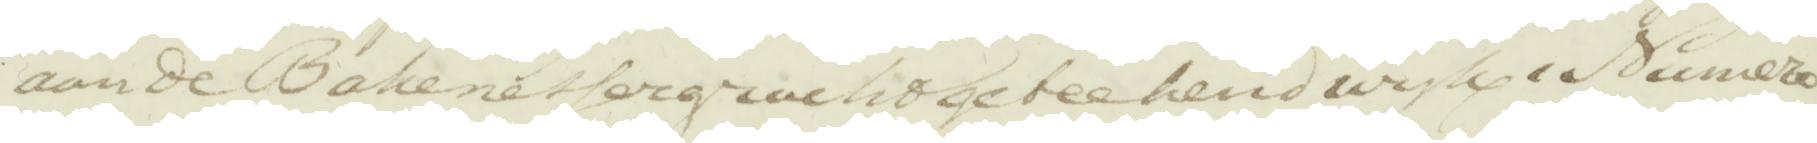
aan de Bakenessergrocht geteekend wyk 1 Numero
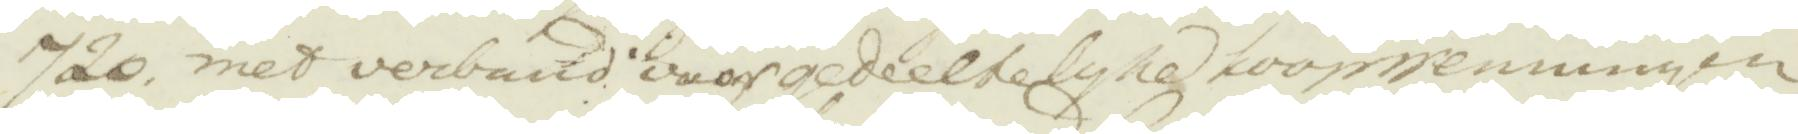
720, met verband voor gedeeltelyke kooppenningen
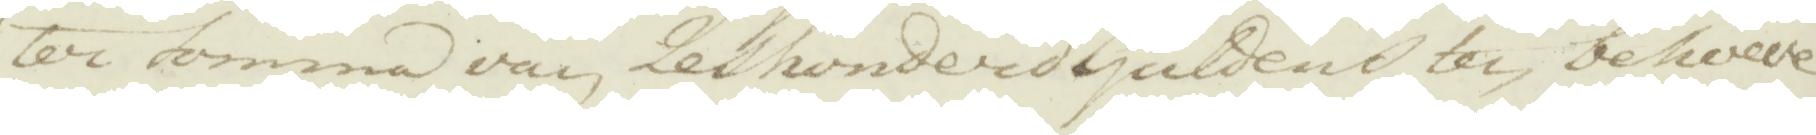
ter somma van Zeshonderd Guldens ten behoeve
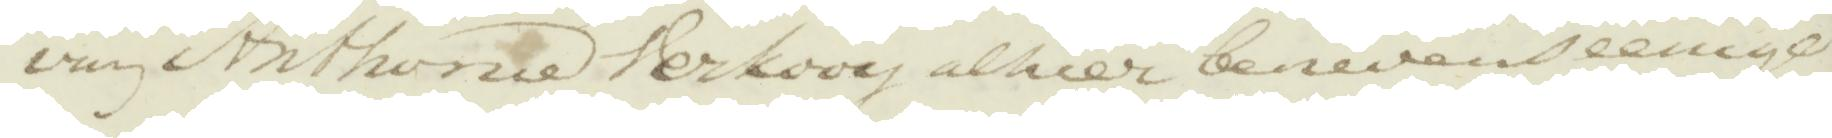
van Anthonie Verkooy alhier benevens eenige
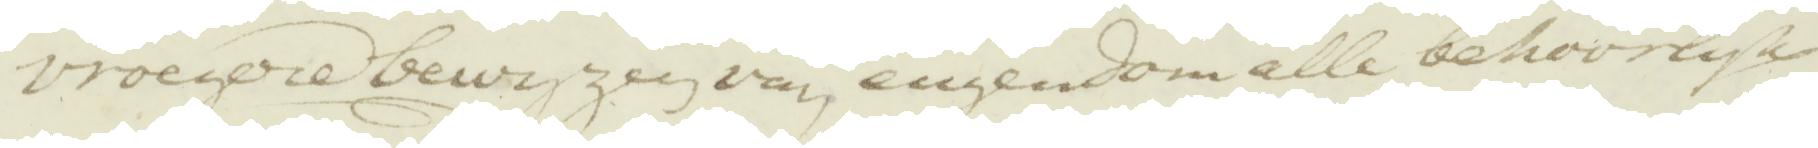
vroegere bewyzen van eigendom alle behoorlyk
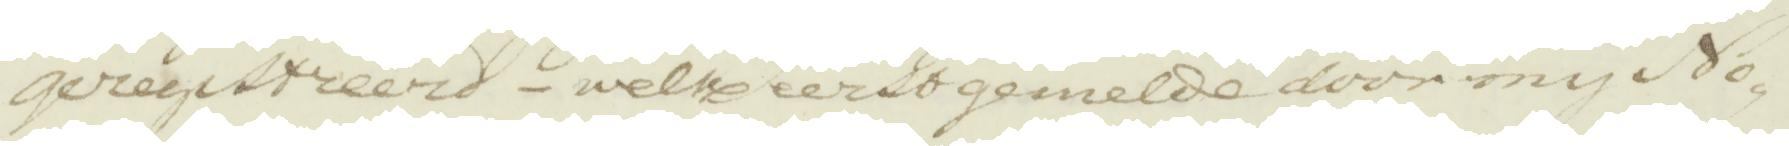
geregistreerd - welk eerstgemelde door my No„
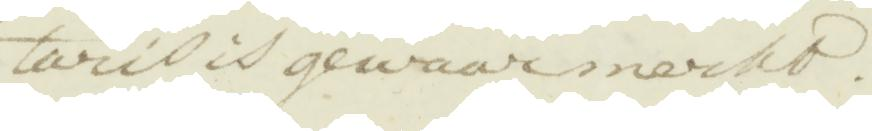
taris is gewaarmerkt.
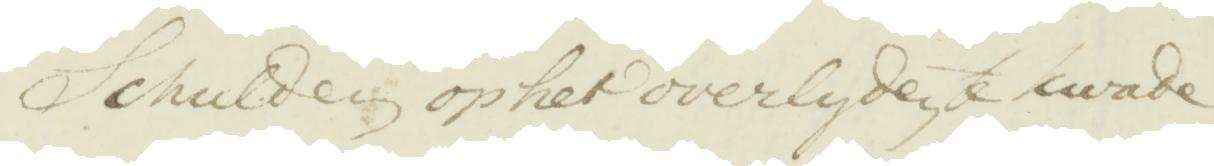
Schulden op het overlyden te kwade
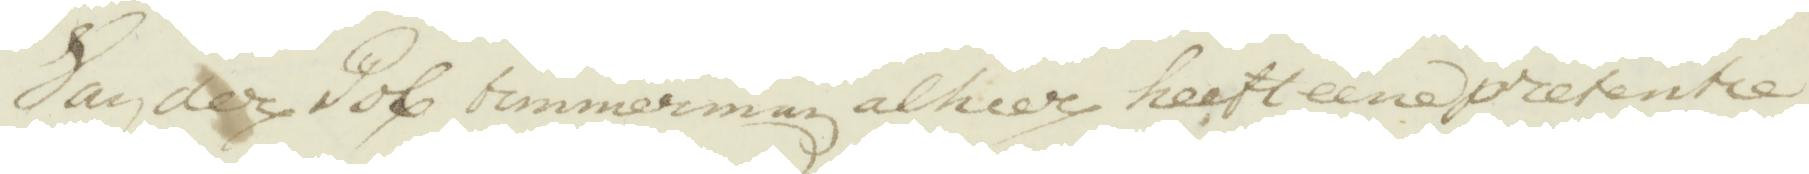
Van der Pol timmerman alhier heeft eene pretentie
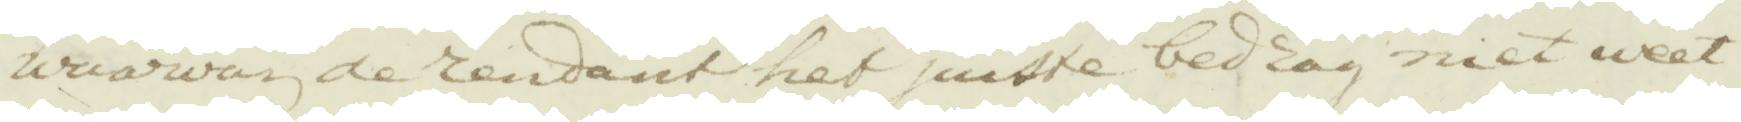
waarvan de rendant het juiste bedrag niet weet
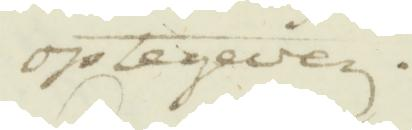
op te geven
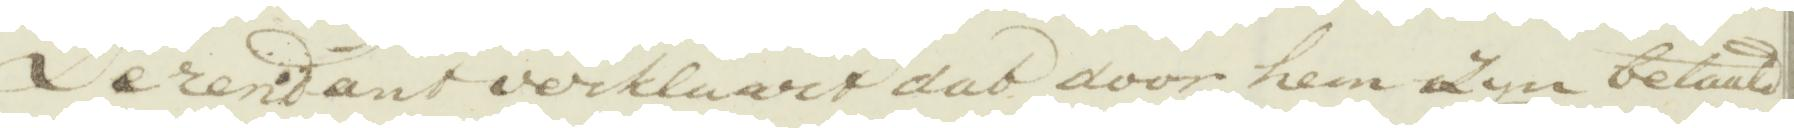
De rendant verklaart dat door hem zyn betaald
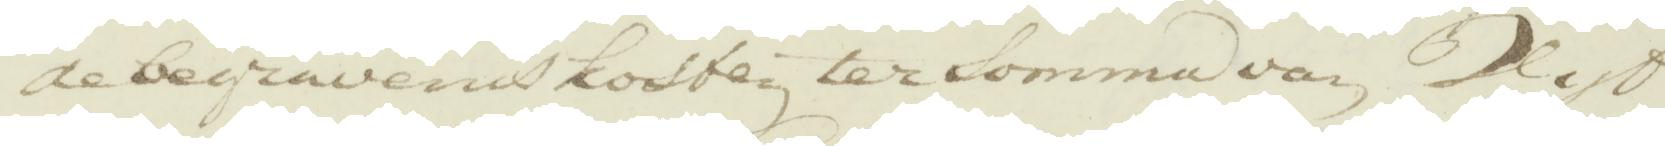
de begravenis kosten ter somma van Vyf
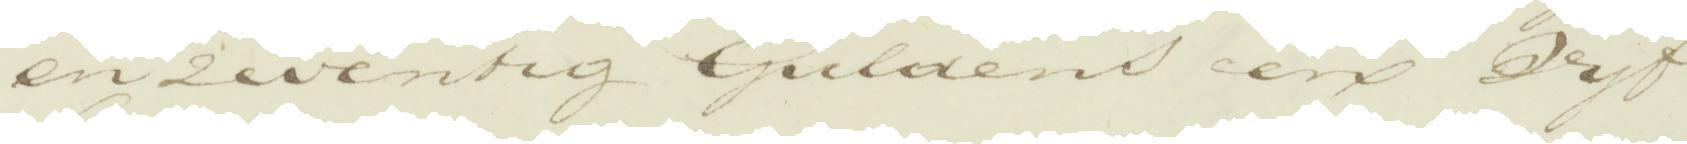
en zeventig Guldens en Vyf
